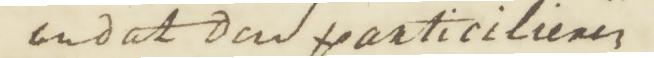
endat den particilieren
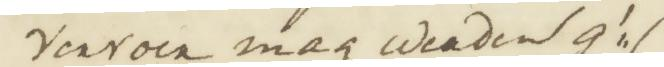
vervoer mag werden g'„
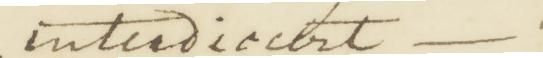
interdiceert —
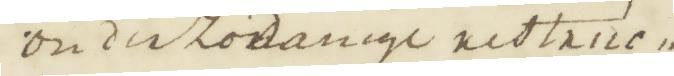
onder zodanige restruc„
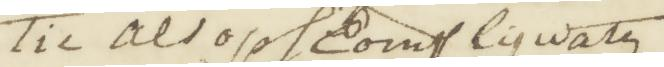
tie als op sComp lijwaten
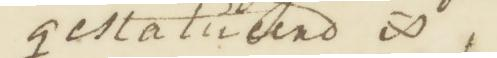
gestatueerd is ,
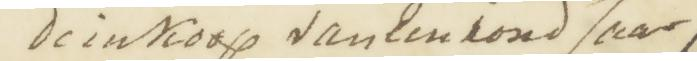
de inkoop van Een rond Jaar
